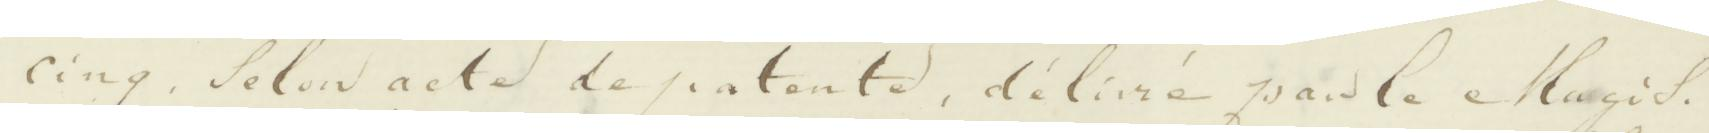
cinq, selon acte de patente, de livre par le Magis.
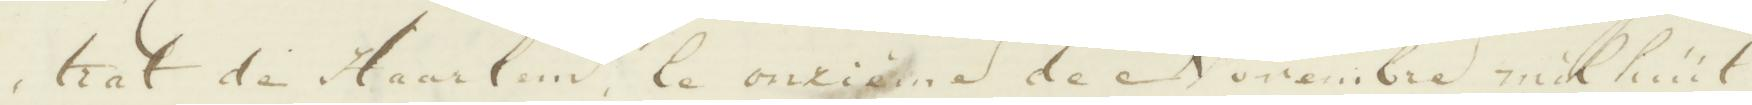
„trat de Haarlem, le onziène de Novembre mil huit
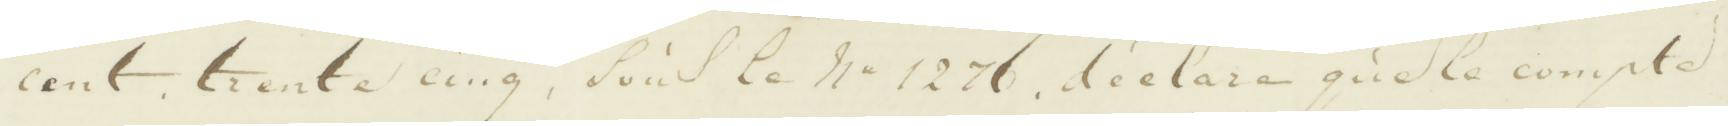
cent. trente cinq, sous le N.o 1276, déclare que le compte
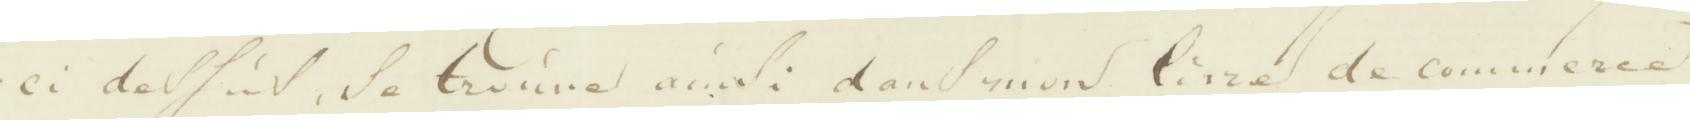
ci dessus, se trouve aussi dans mon livre de commerce
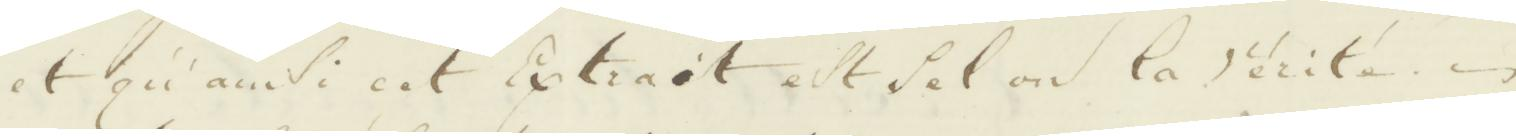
et qu'aussi cet Extract est selon la vérité.
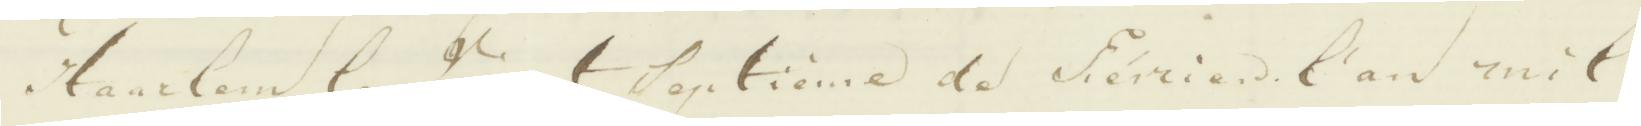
Haarlem la Vingt septieme de Février l'an mil
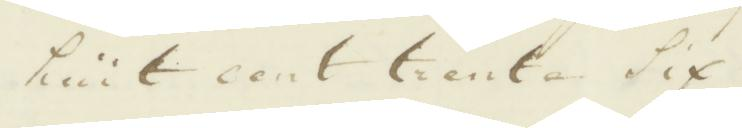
huit cent trente six
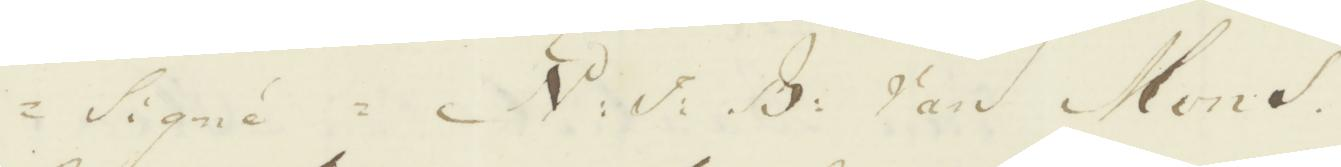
= Signé = N: V: B: Van Mons.
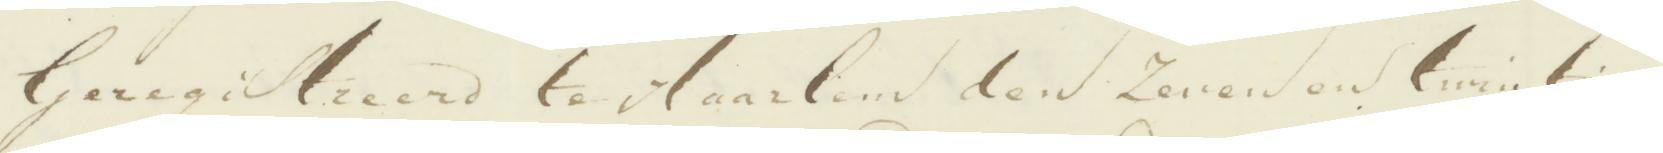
Geregistreerd te Haarlem den zeven en twintig
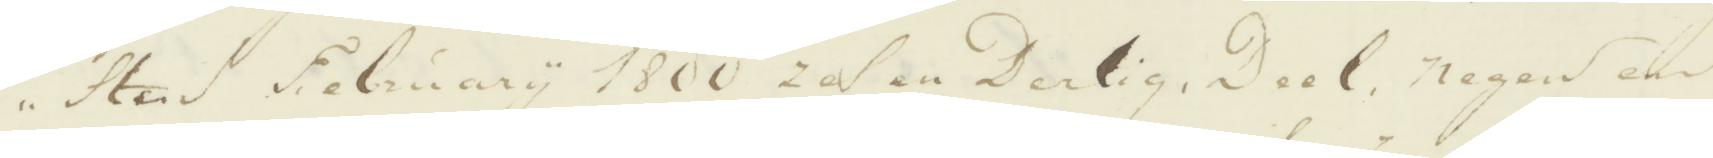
„sten Februarij 1800 zes en Dertig, Deel, negen en
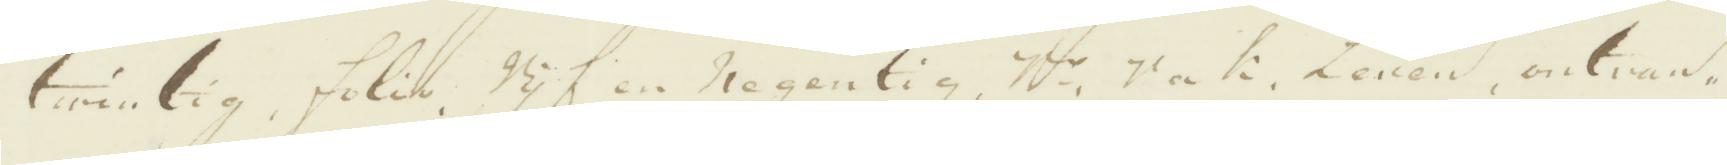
twintig, folio, Vijf en negentig, V=o, vak, Zeven, ontvan„
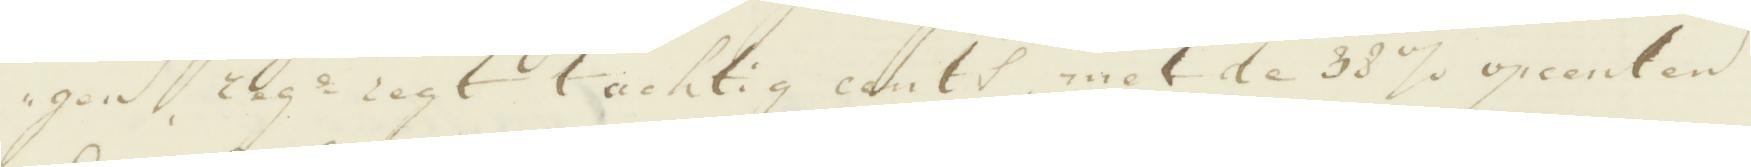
„gen . reg=e regt tachtig cents, met de 38% opcenten
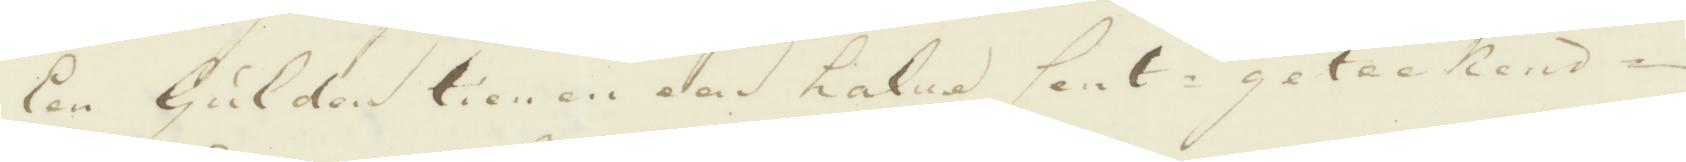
Een Gulden tien en een halve Cent = geteekend =
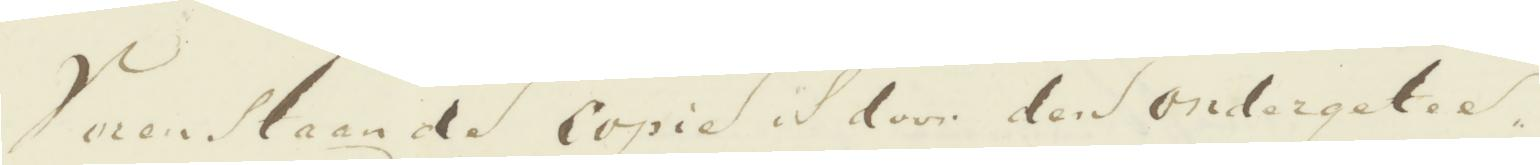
Vorenstaande Copie is door den ondergetee„
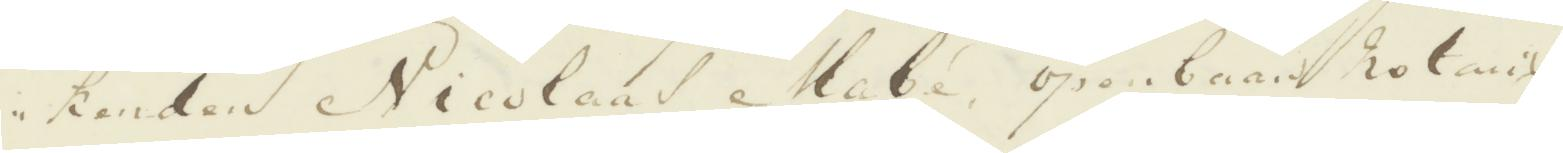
„kenden Nicolaas Mabé, openbaar Notaris
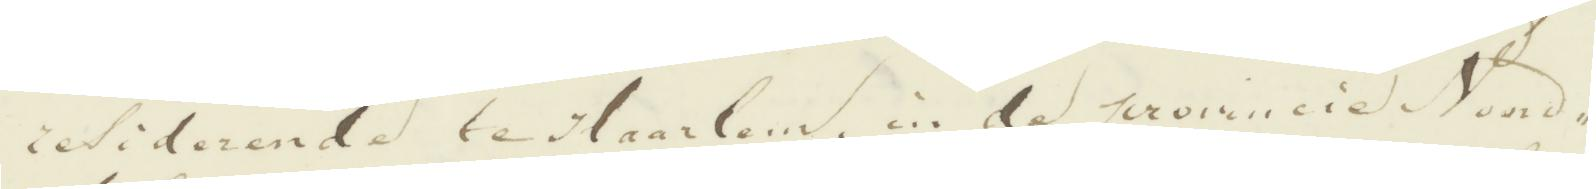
residerende te Haarlem, in de provincie Noord„
